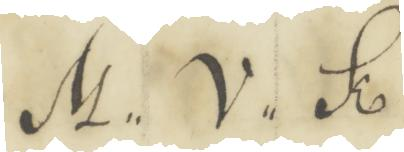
M„ V„ K
